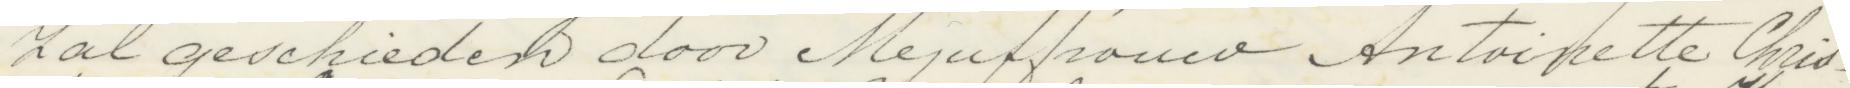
zal geschieden door Mejuffrouw Antoinette Chris
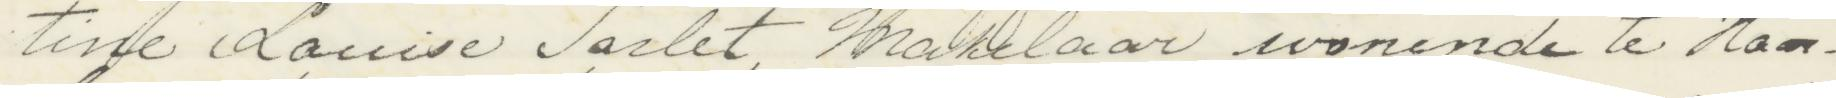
tine Louise Sarlet, Makelaar wonende te Haar
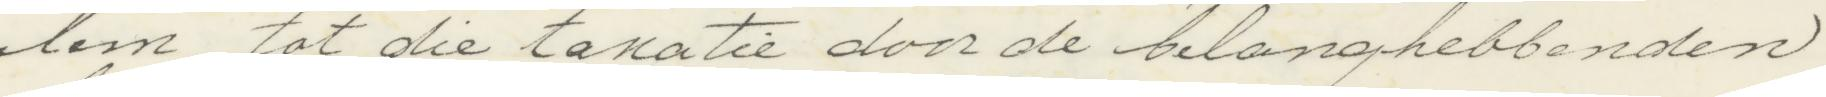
lem, tot die taxatie door de belanghebbenden
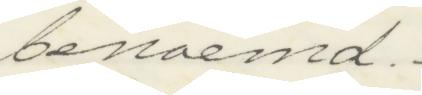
benoemd.
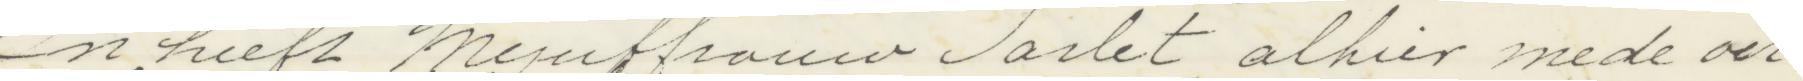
En heeft Mejuffrouw Sarlet, alhier mede ver
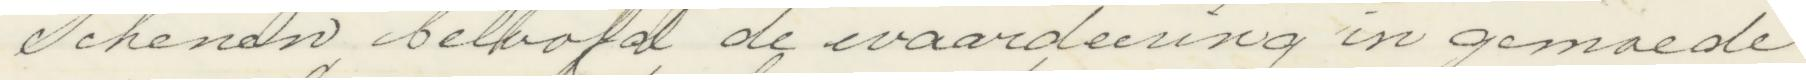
schenen, beloofd de waardeering in gemoede
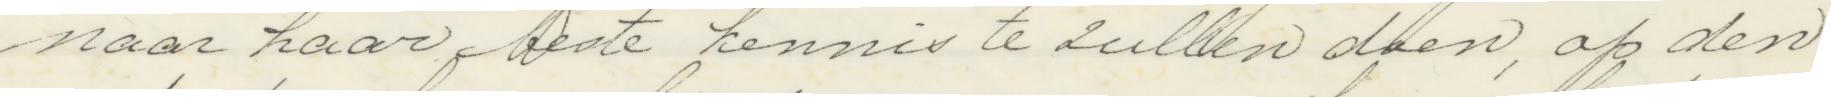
naar haar beste kennis te zullen doen, op den
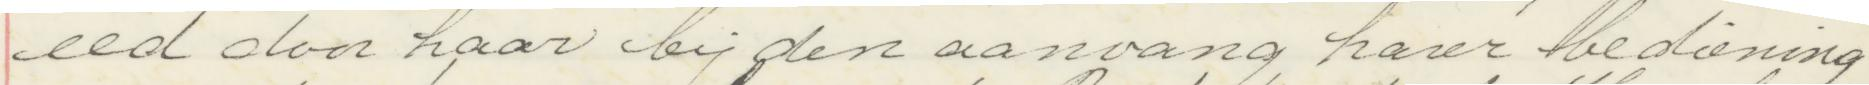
eed door haar bij den aanvang haar bediening
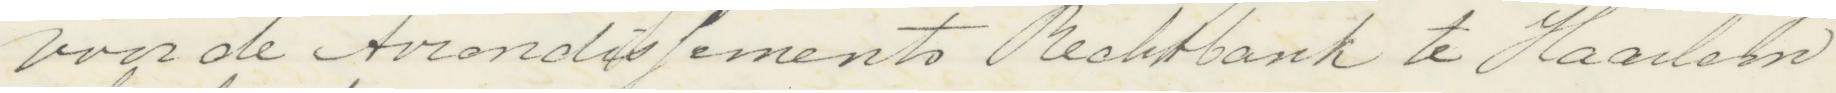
voor de Arrondissements Rechtbank te Haarlem
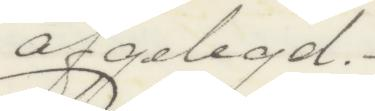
afgelegd.
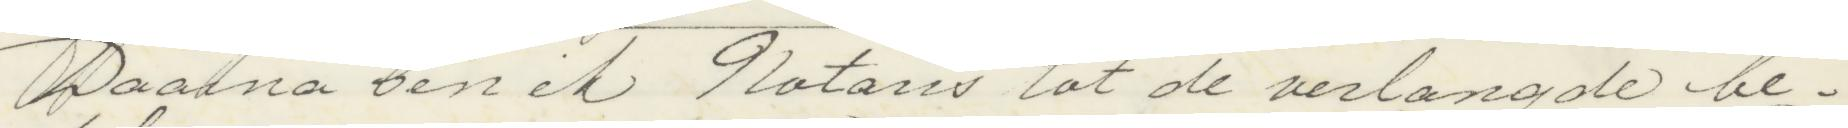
Daarna ben ik Notaris tot de verlangde be-
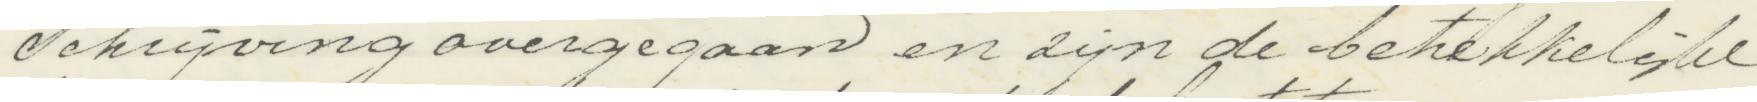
schrijving overgegaan en zijn de betrekkelijke
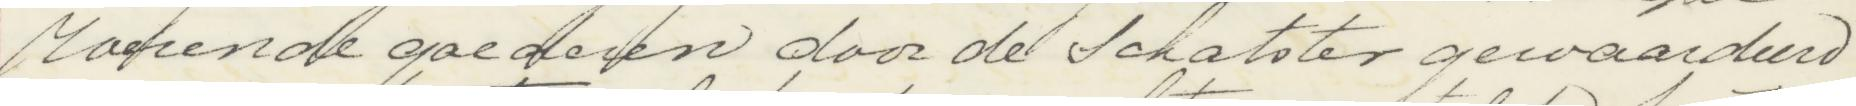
roerende goederen door de Schatster gewaardeerd
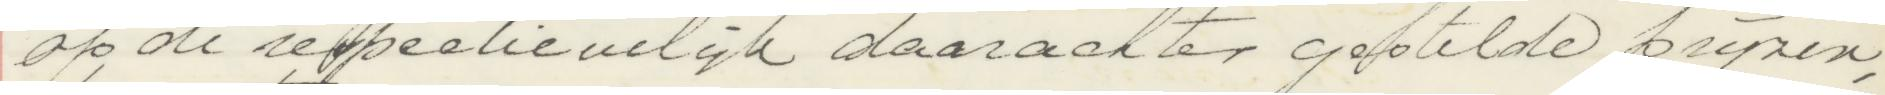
op de respectievelijk daarachter gestelde prijzen,
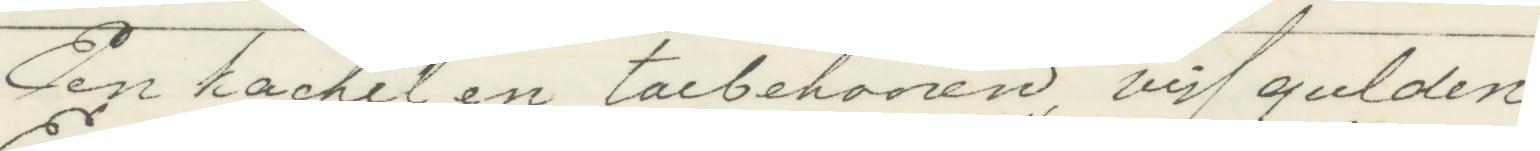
Een kachel en toebehooren, vijf gulden
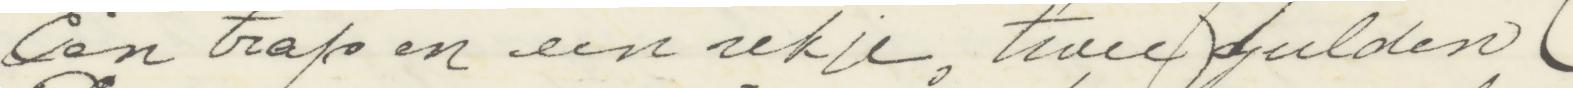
Een trap en een rekje, twee gulden
